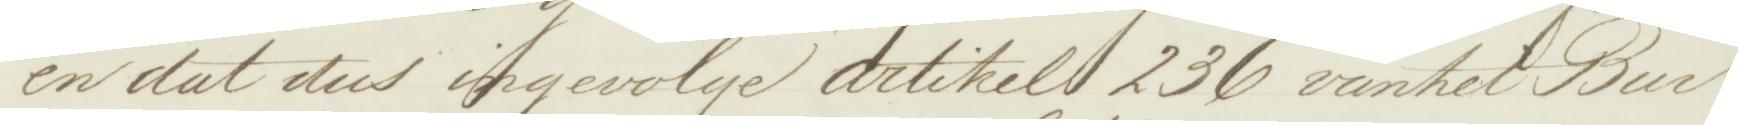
en dat dus ingevolge artikel 236 van het Bur.
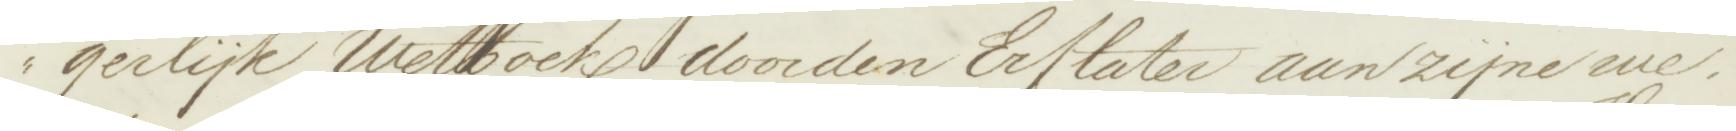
„gerlijk Wetboek door den Erflater aan zijne we„
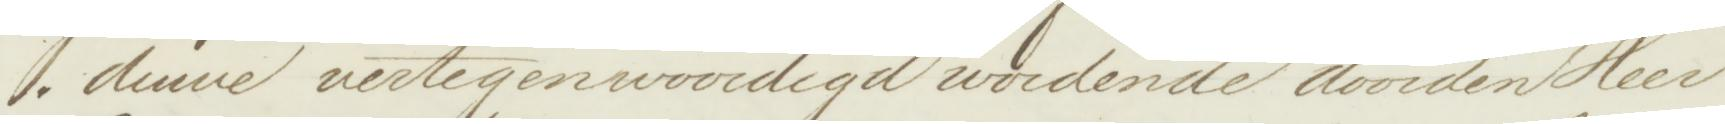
duwe vertegenwoordigd wordende door den Heer
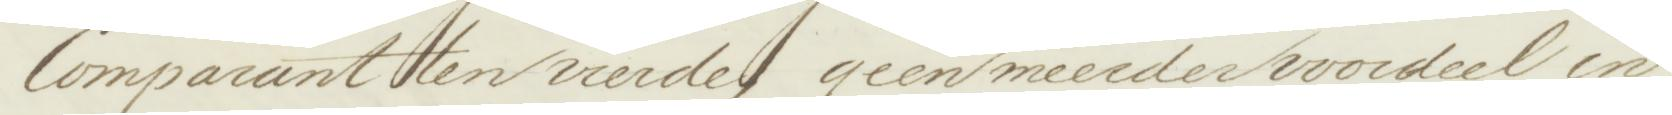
Comparant ten vierde geen meerder voordeel in
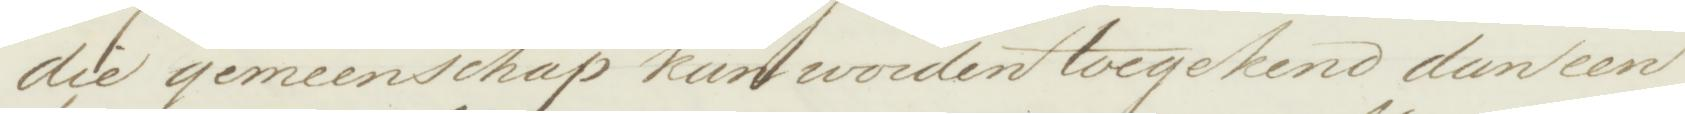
die gemeenschap kan worden toegekend dan een
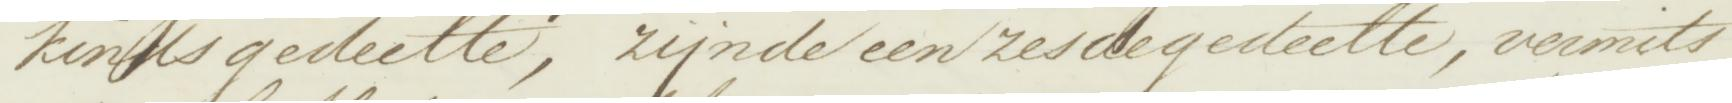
kinds gedeelte, zijnde een zesde gedeelte, vermits
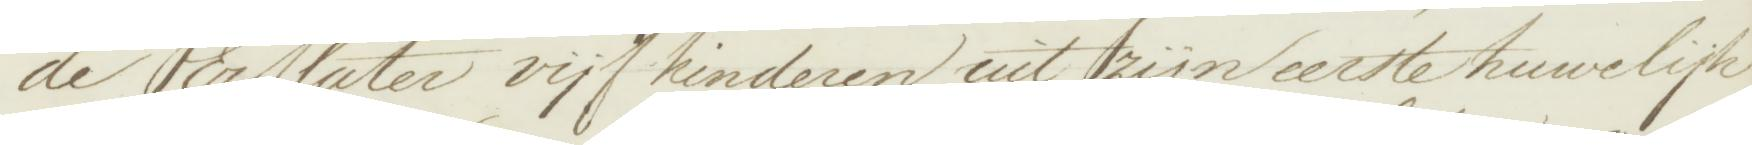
de Erflater vijf kinderen uit zijn eerste huwelijk
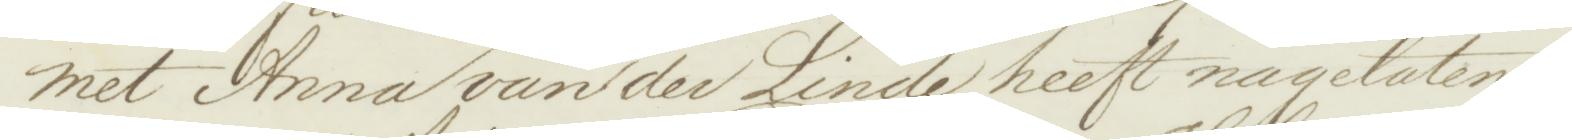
met Anna van der Linde heeft nagelaten, ge
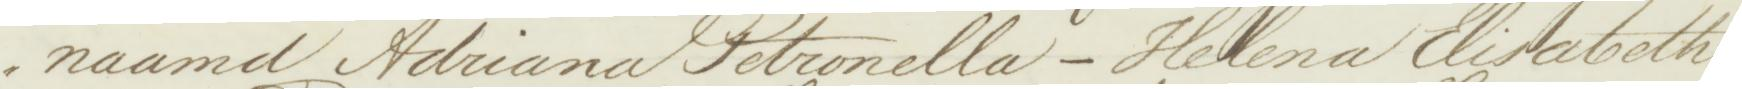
„naamd Adriana Petronella - Helena Elisabeth-
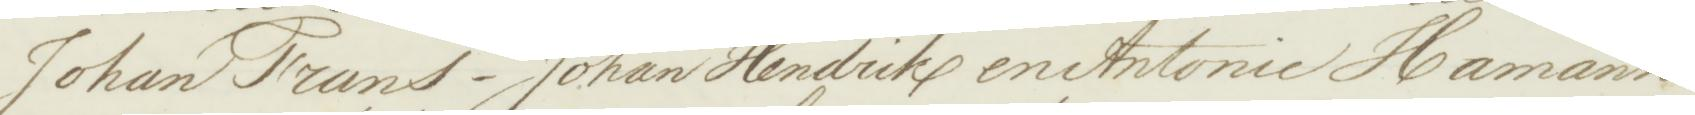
Johan Frans - Johan Hendrik en Antonie Hamann
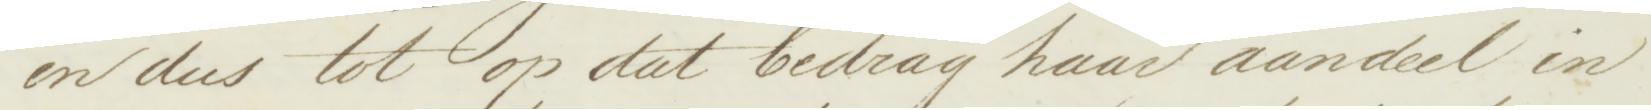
en dus tot op dat bedrag haar aandeel in
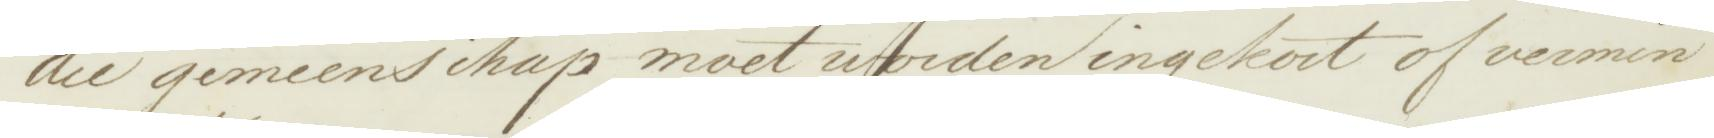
die gemeenschap moet worden ingekort of vermin
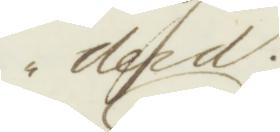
„ derd.
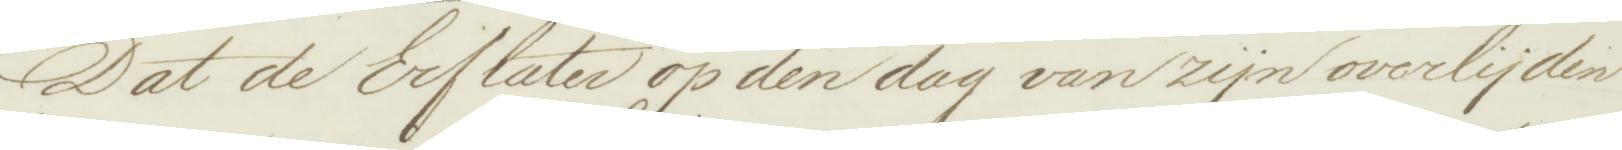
Dat de Erflater op den dag van zijn overlijden
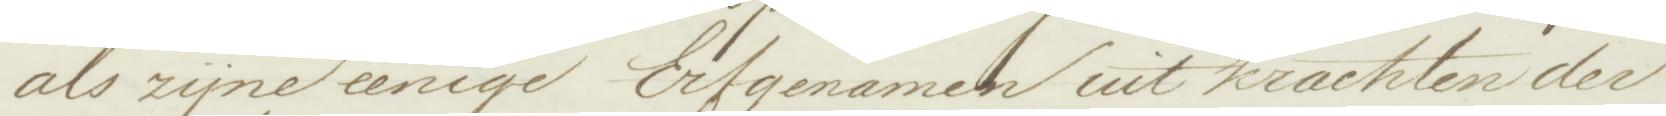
als zijne eenige Erfgenamen uit krachten der
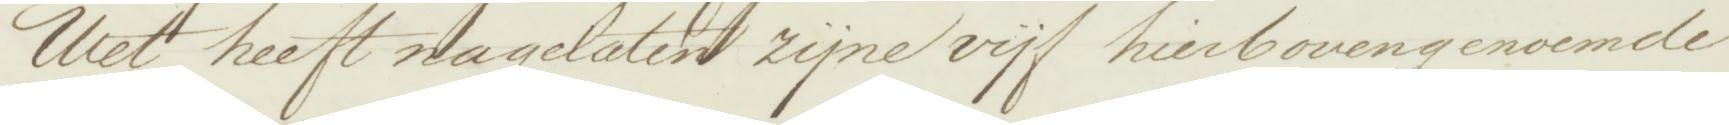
Wet heeft nagelaten zijne vijf hierbovengenoemde
